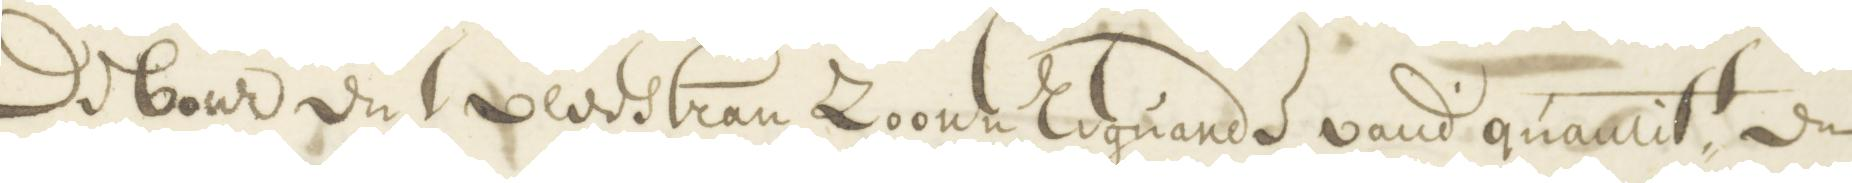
De bour en 't vlees kan, zoo en Reguarde van d’ quantitt„en
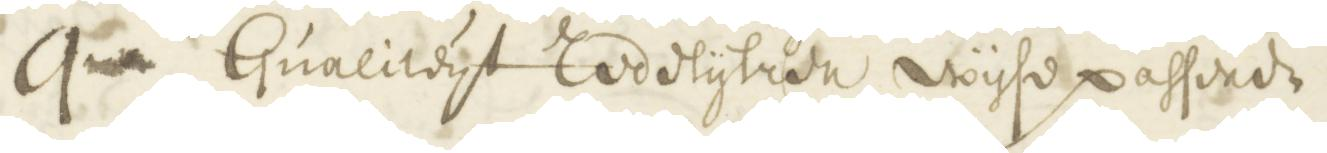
4 Qualiteijt redelijker wijse passeren
